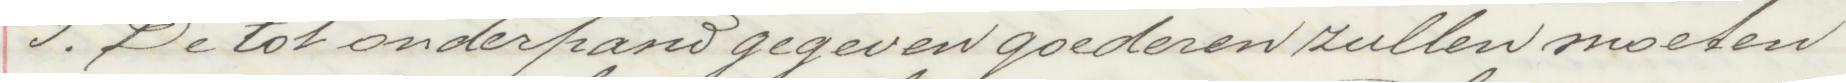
3. De tot onderhand gegeven goederen zullen moeten
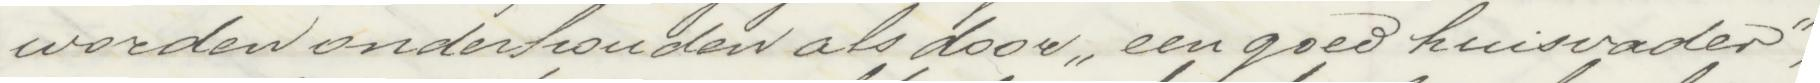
worden onderhouden als door „een goed huisvader",
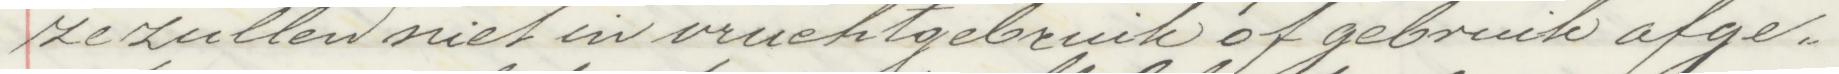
ze zullen niet in vruchtgebruik of gebruik afge„
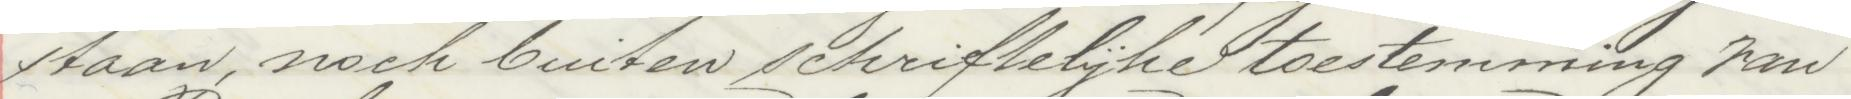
staan, noch buiten schriftelijke toestemming van
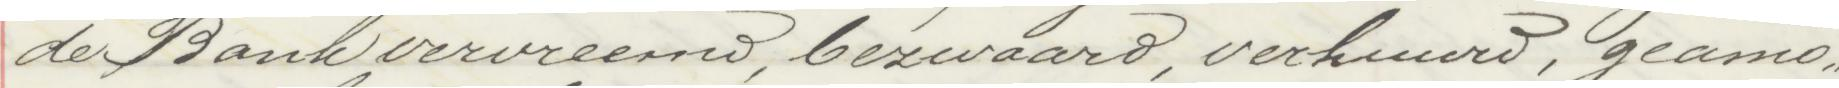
de Bank vervreemd, bezwaard, verhuurd, geamo„
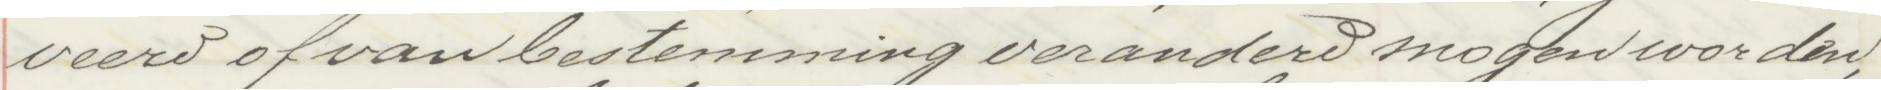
veerd of van bestemming veranderd mogen worden,
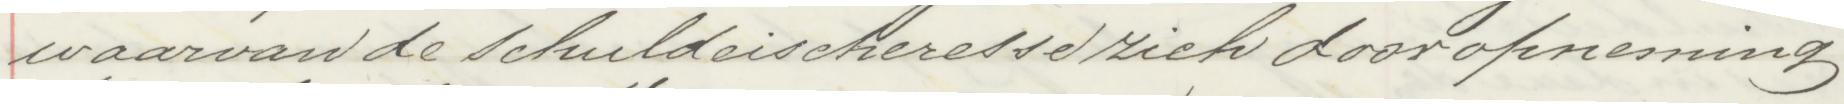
waarvan de schuldeischeresse zich door opneming
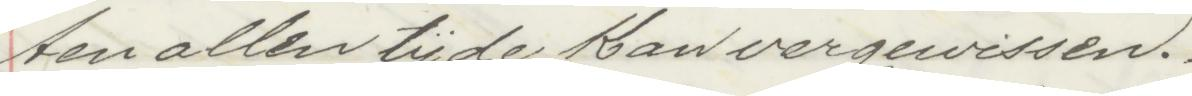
ten allen tijde kan vergewissen.
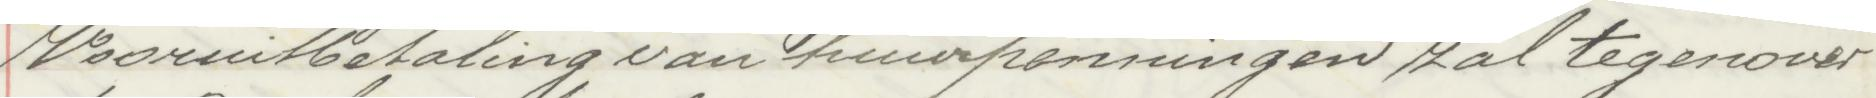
Vooruitbetaling van huurpenningen zal tegenover
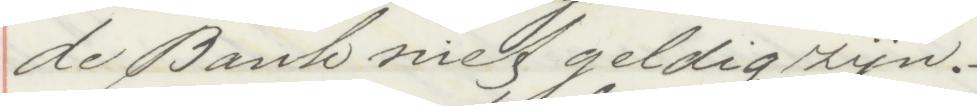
de Bank niet geldig zijn.
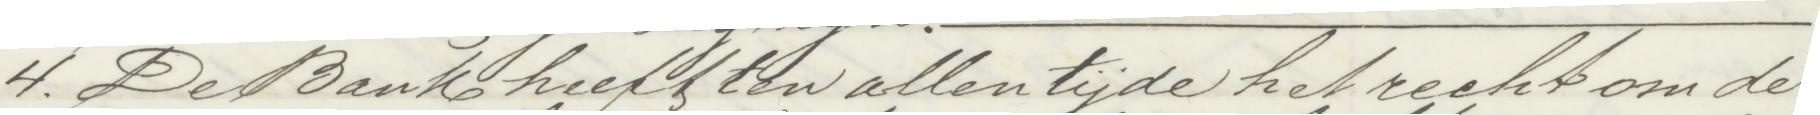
1. De Bank heeft ten allen tijde het recht om de
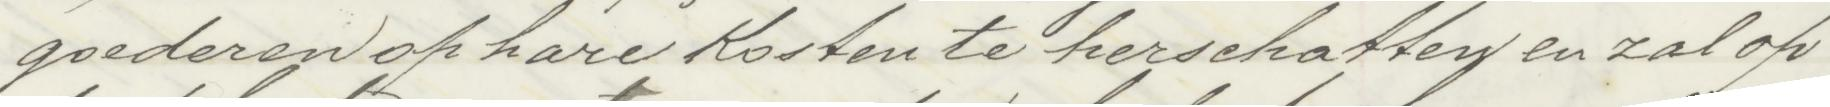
goederen op hare kosten te herschatten en zal op
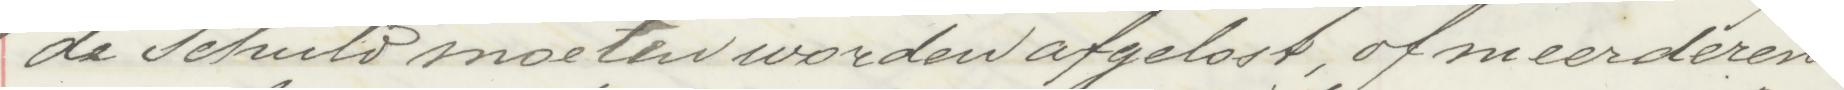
de schuld moeten worden afgelost, of meerderen
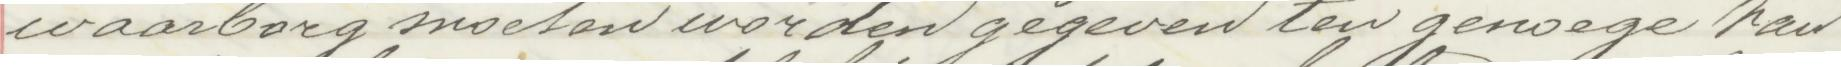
waarborg moeten worden gegeven ten genoege van
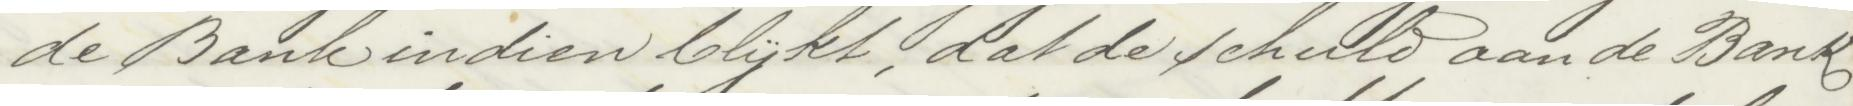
de Bank indien blijkt, dat de schuld aan de Bank
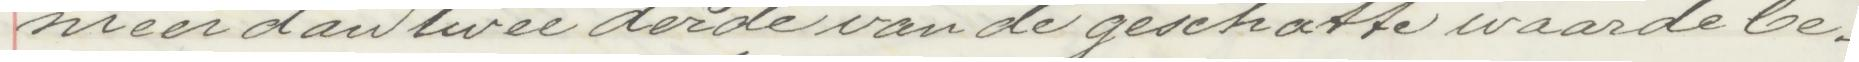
meer dan twee derde van de geschatte waarde be„
